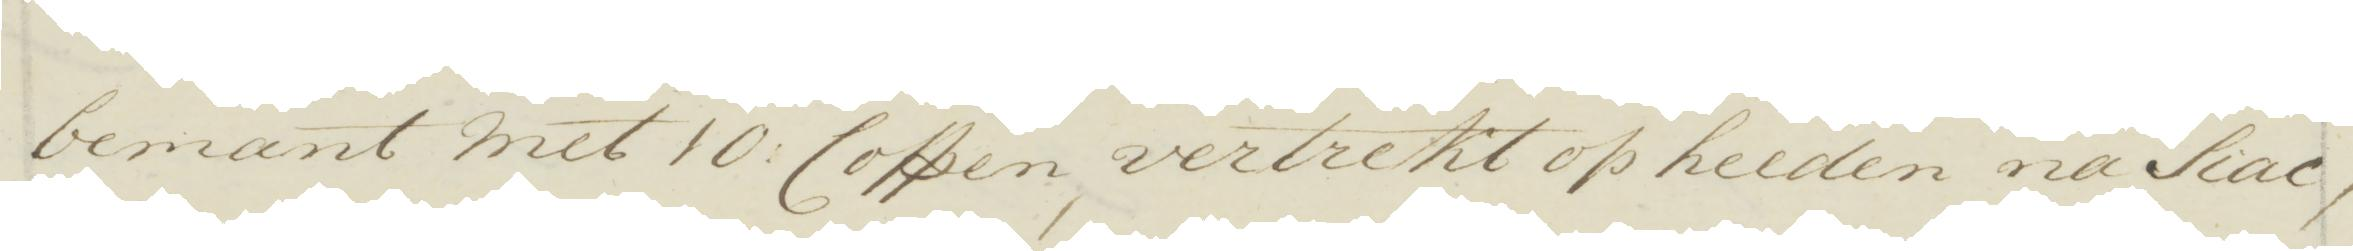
bemant met 10: coppen vertrekt op heeden na Siac,
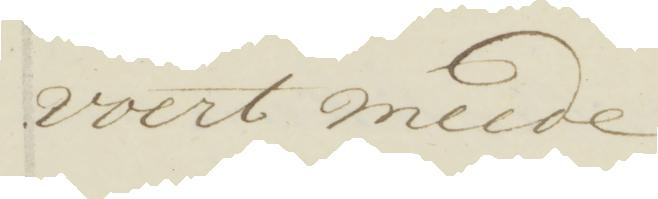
voert meede
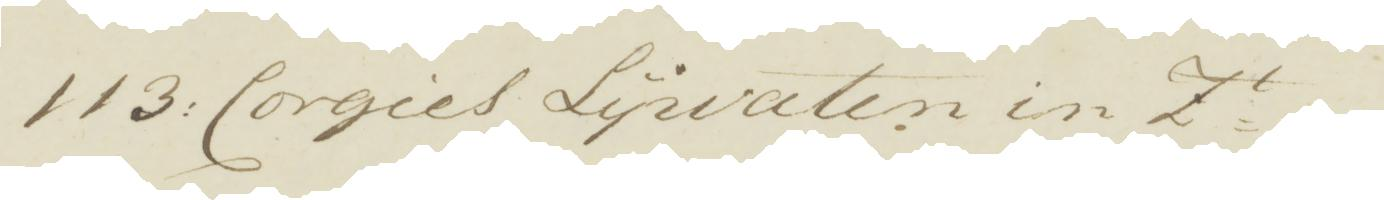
113: Corgies Lijwaten in Z:t
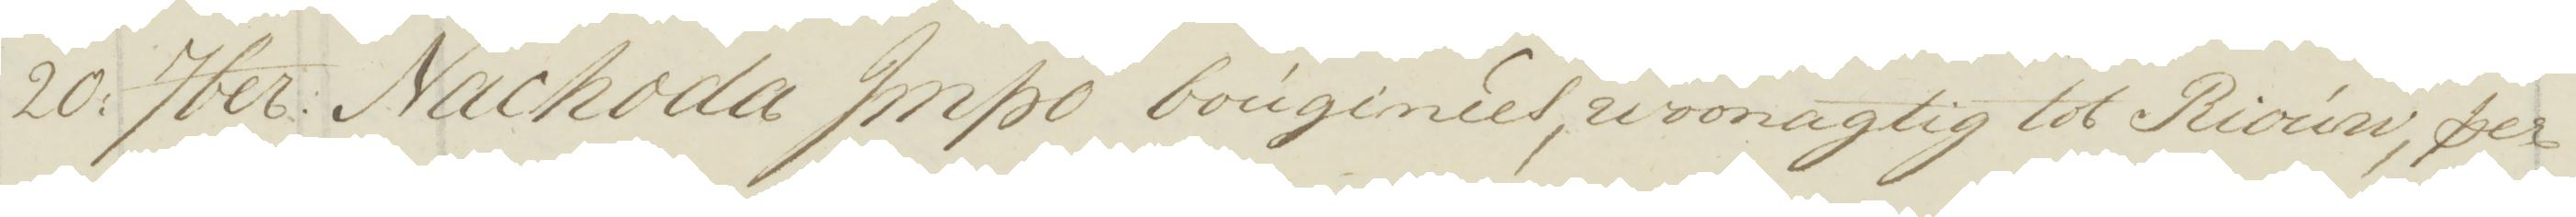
20: 7ber: Nachoda Jmpo bouginees, woonagtig tot Riouw, per
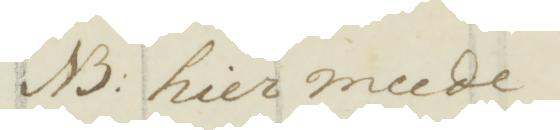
NB: hier meede
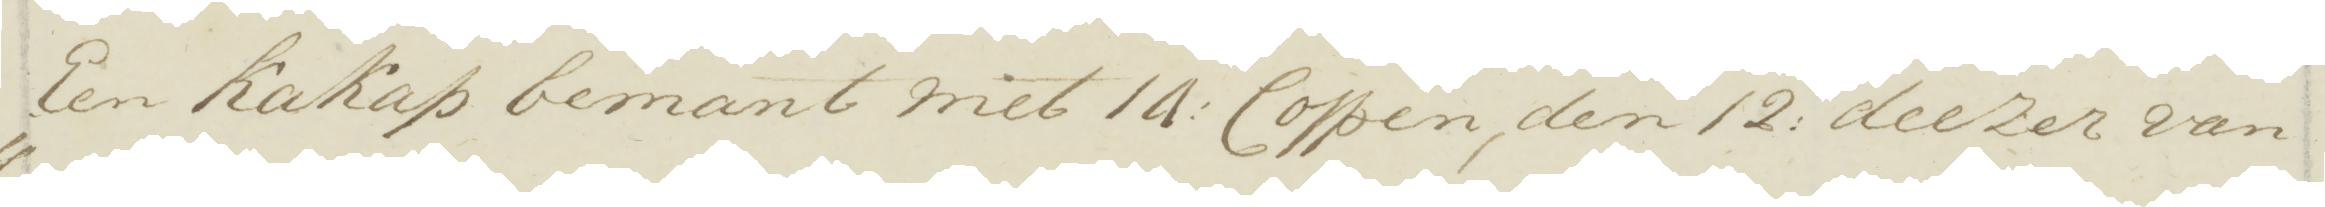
Een kakap bemant met 14: coppen, den 12:e deezer van
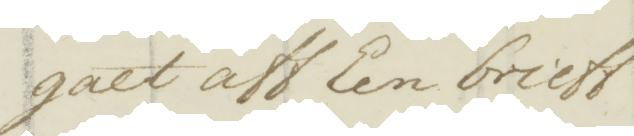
gaet aff Een brieff
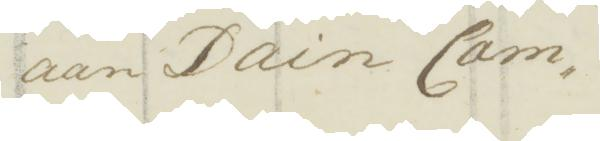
aan Dain Cam„
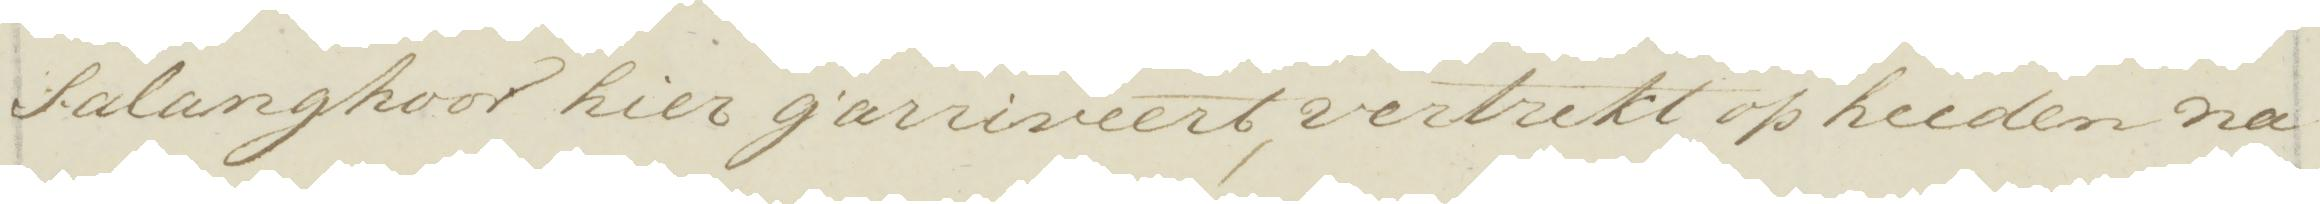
Salanghoor hier g'arriveert, vertrekt op heeden na
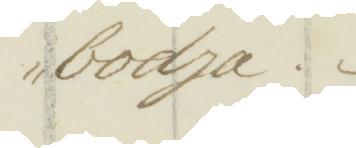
„bodja.
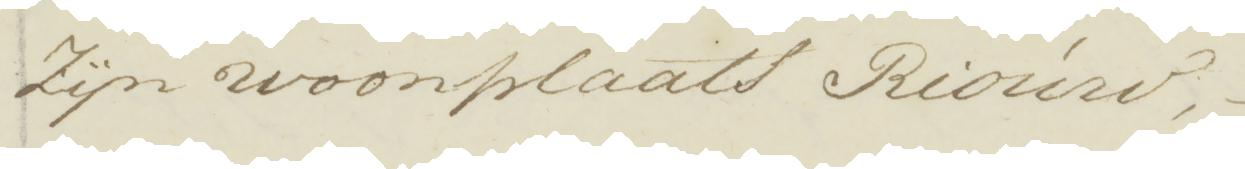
zijn woonplaats Riouw.
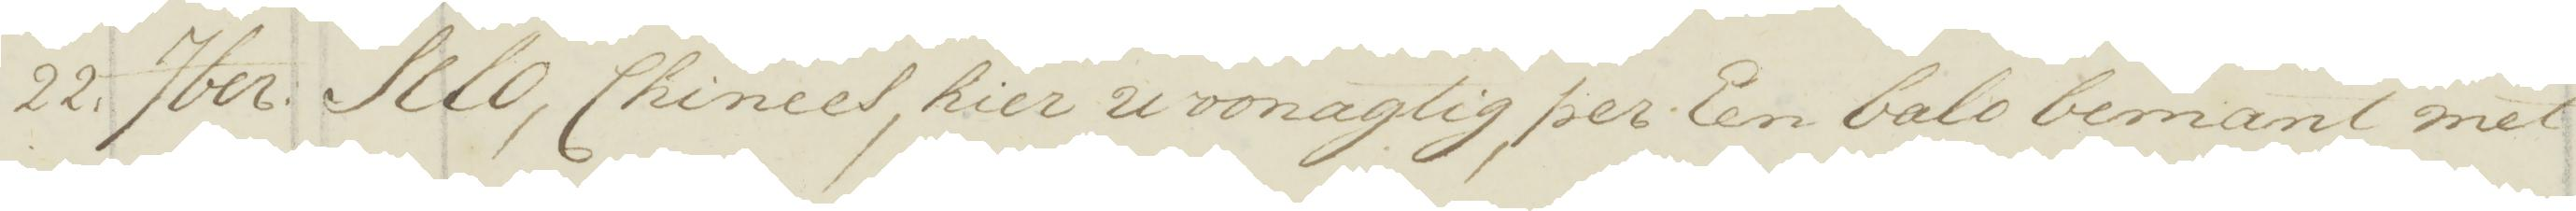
22. 7ber: Selo, Chinees, hier woonagtig per: Een balo bemant met
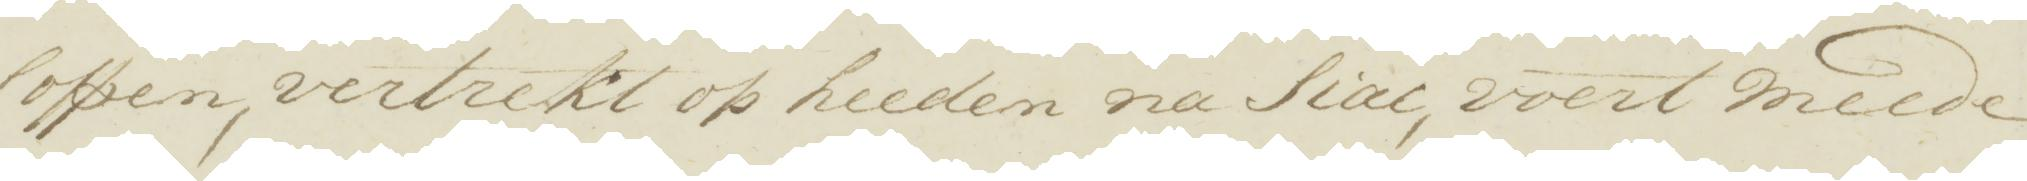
6 coppen, vertrekt op heeden na Siac, voert meede
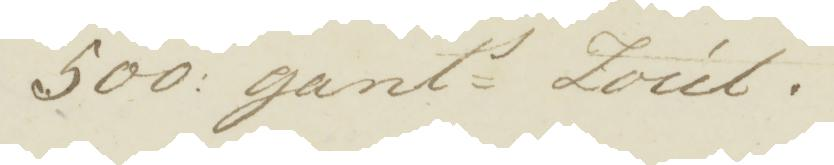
500: gant=s zout.
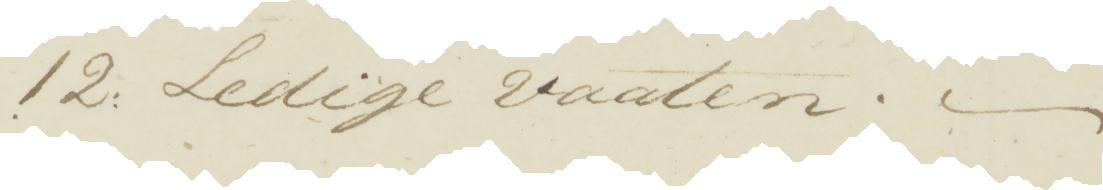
12: Ledige vaaten:
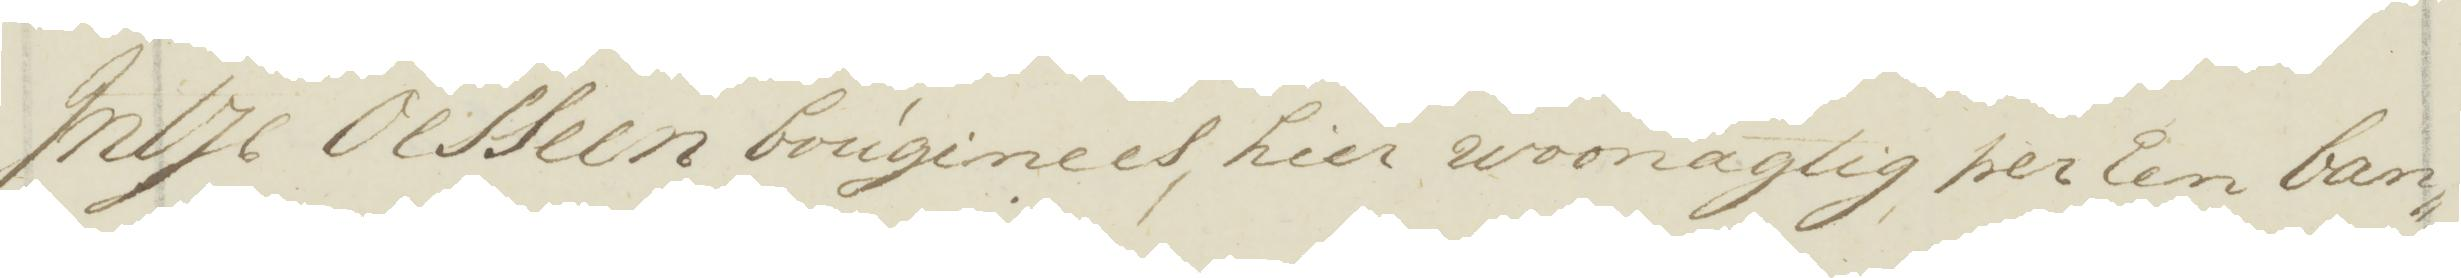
Jntje Oesseen bouginees, hier woonagtig per Een ban„
